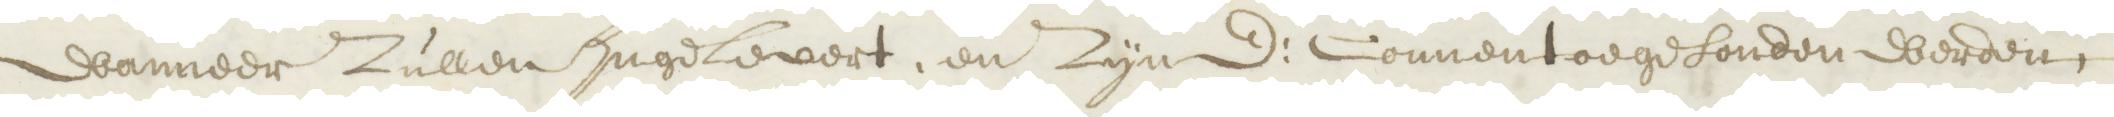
wanneer zullen jngelevert, en zijn E: connen toegesonden werden,
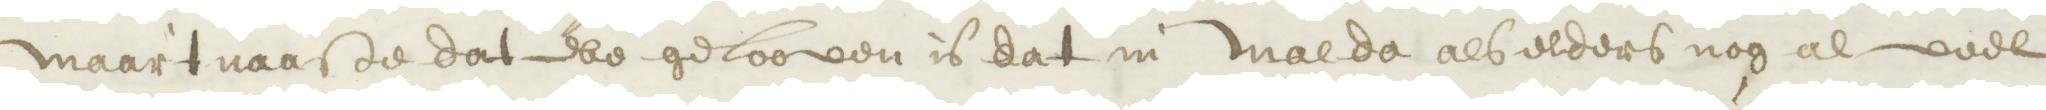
maar ’t naaste dat we gelooven is dat in Malda als elders nog al veel
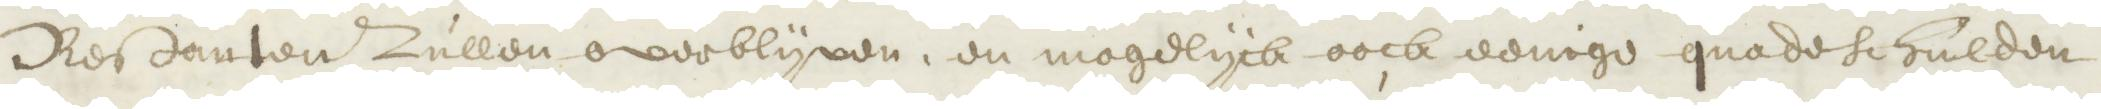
Restanten zullen overblijven, en mogelijck oock eenige quade schulden
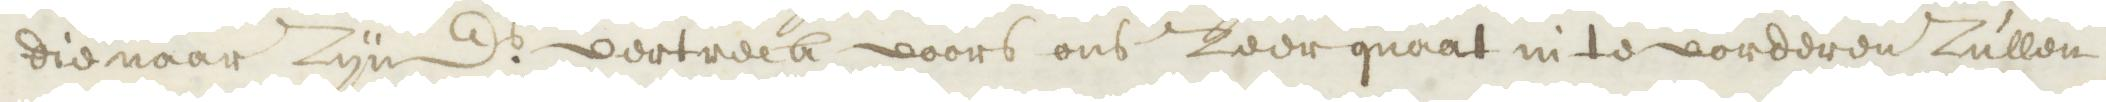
die naar zijn E:s vertreck voors ons zeer quaat in te vorderen zullen
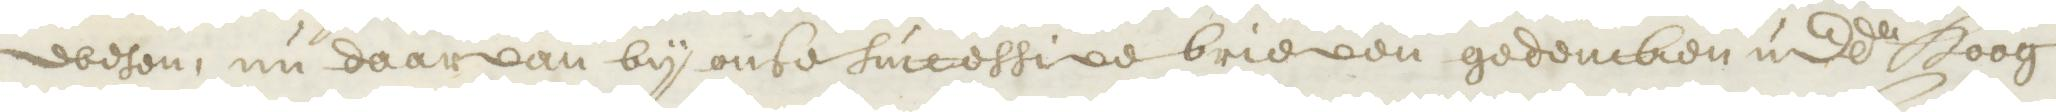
wesen, nu daarvan bij onse successive brieven gedencken u Edle Hoog
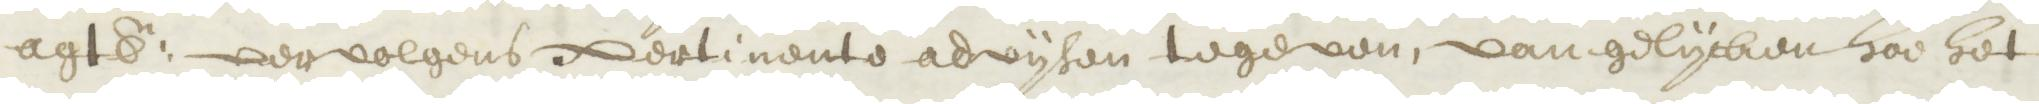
agtb:' vervolgens pertinente advijsen te geven, van gelijcken hoe het
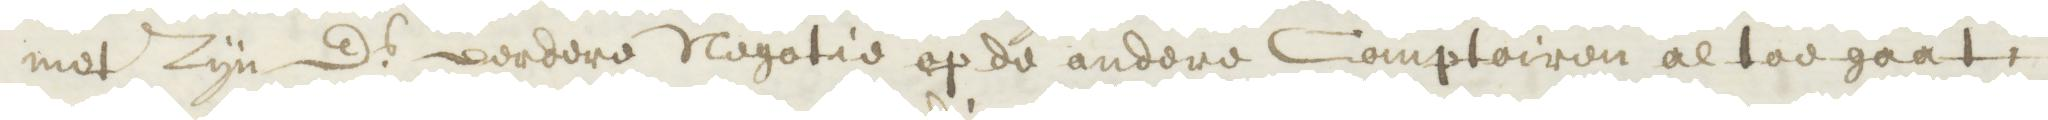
met zijn E.s verdere Negotie op de andere Comptoiren al toegaat,
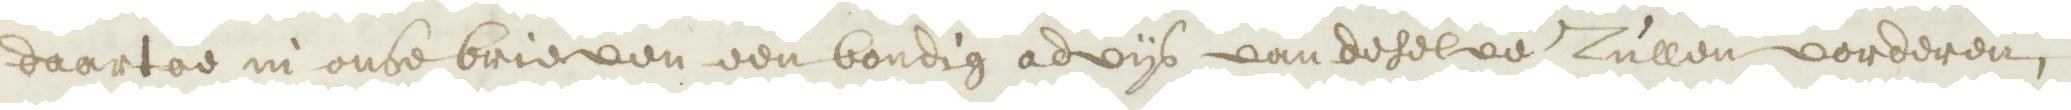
daartoe in onse brieven een bondig advijs van deselve zullen vorderen,
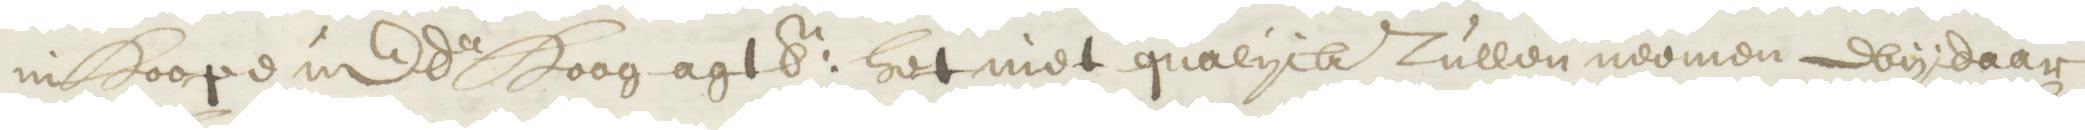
in Hoope u Edle Hoog agtb:' het niet qualijck zullen neemen wij daar
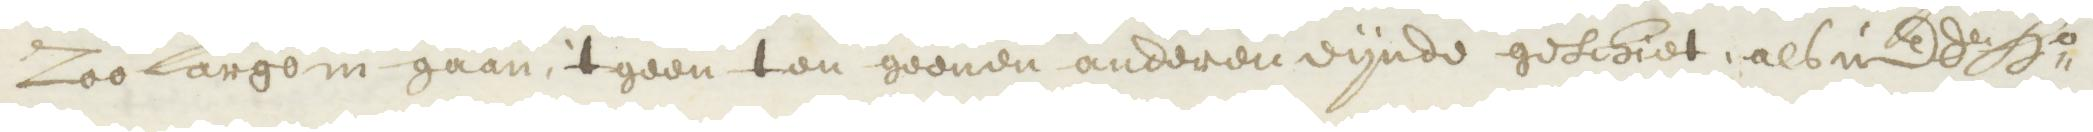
zoo largo in gaan, ’tgeen ten geenen anderen eijnde geschiet, als u Ede H„o
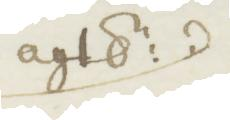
agtb:'
